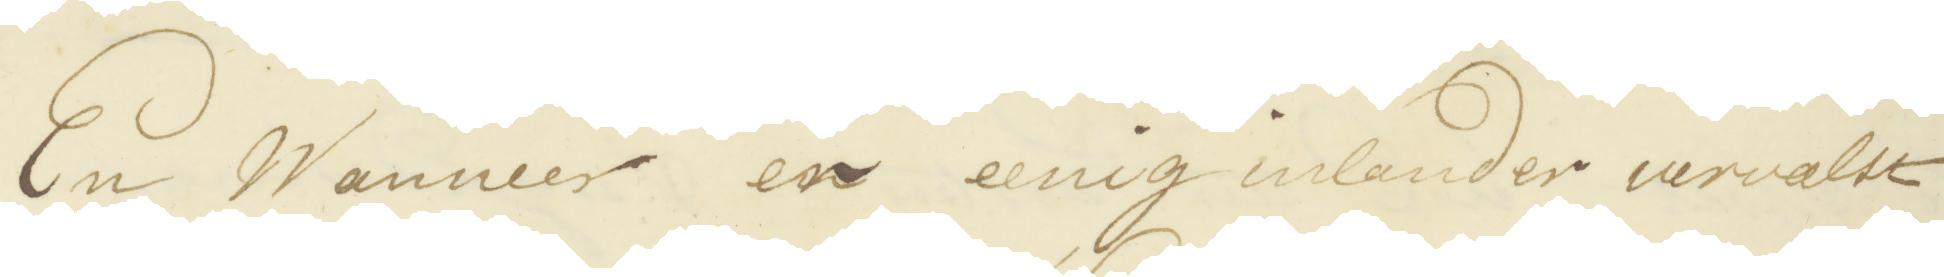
En Wanneer er eenig inlander vervalst
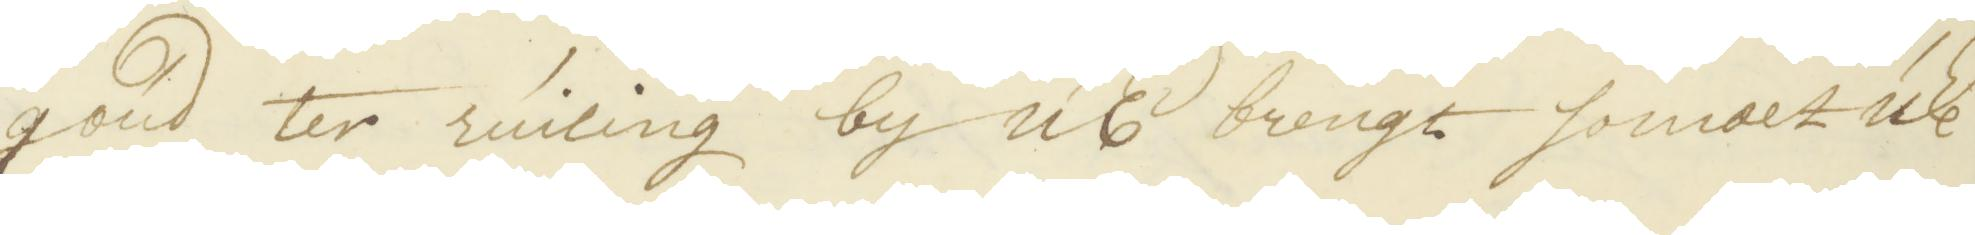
goud ter ruiling by uE brengt somoet uE
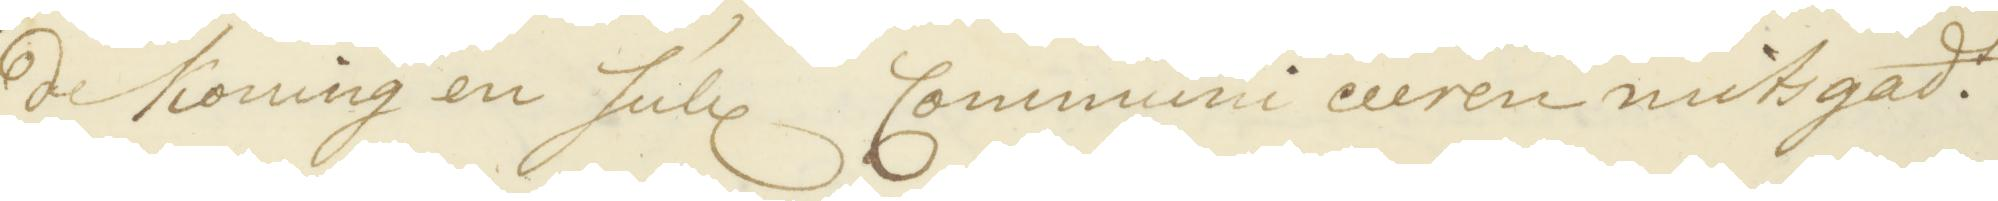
de koning en sulx Communiceeren mitsgad.s
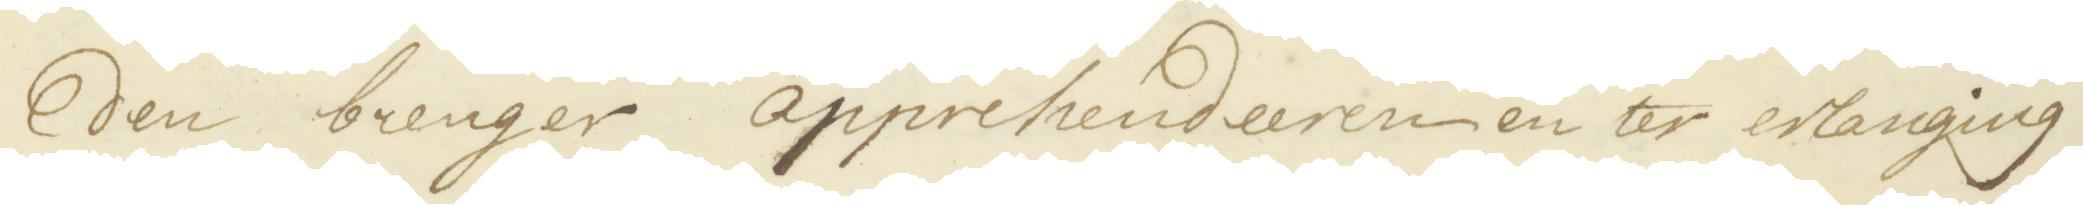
den brenger apprehendeeren en ter erlanging
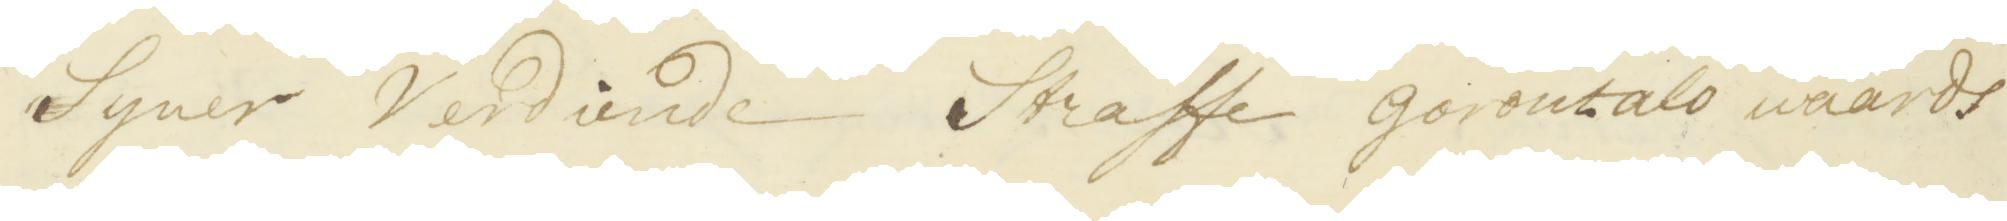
syner verdiende straffe goroutalo waards
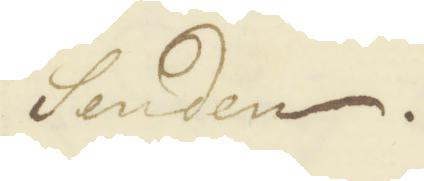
senden.
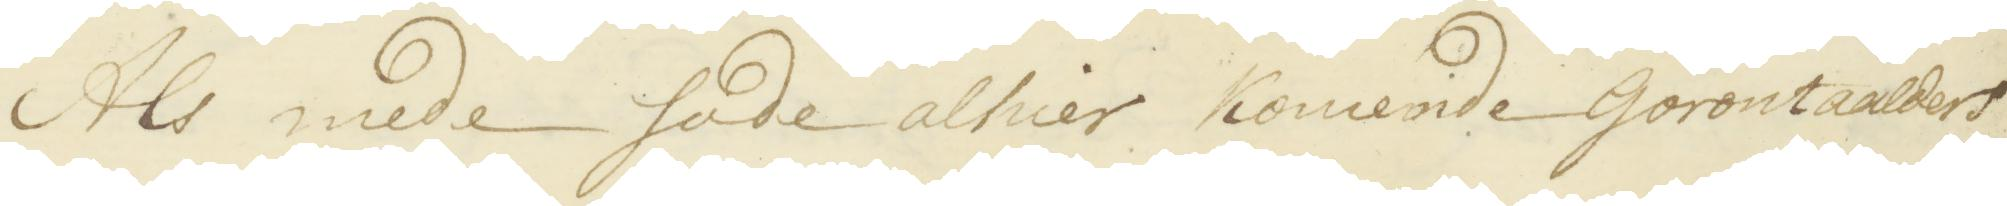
Als mede sode alhier komende Gorontaalders
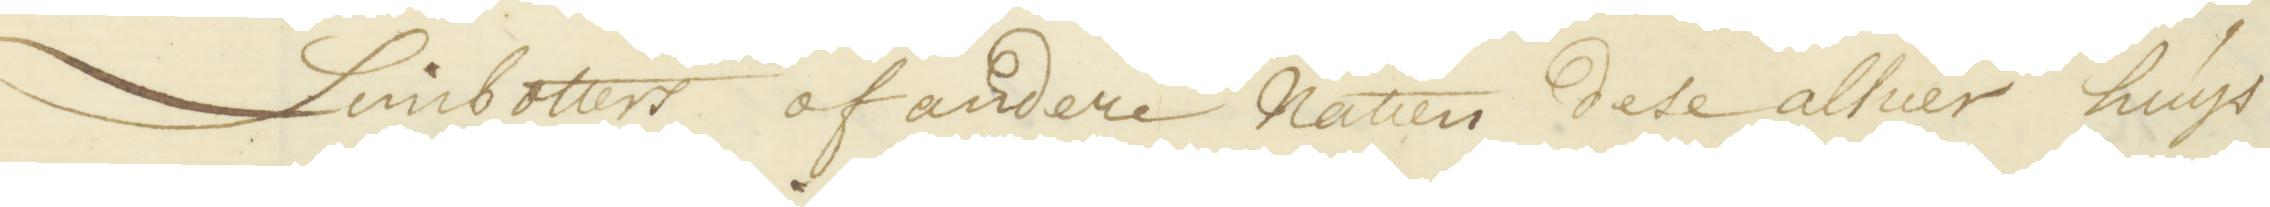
Limbotters of andere natien dese alhier huys
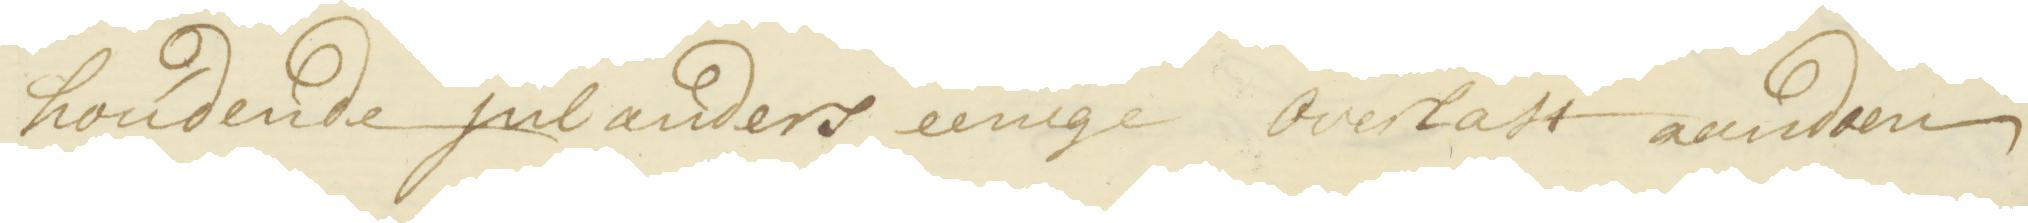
houdende sul anders eenige overlast aandoen
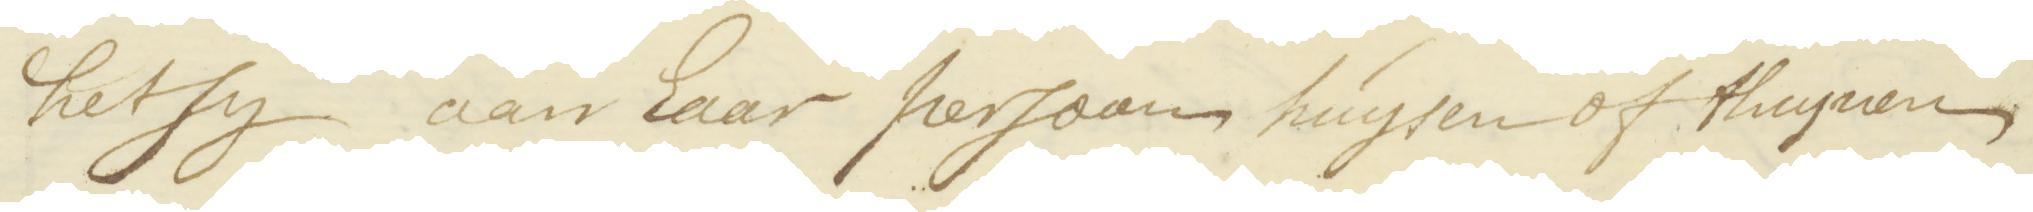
hetsy aan haar persoon huysen of thuynen
